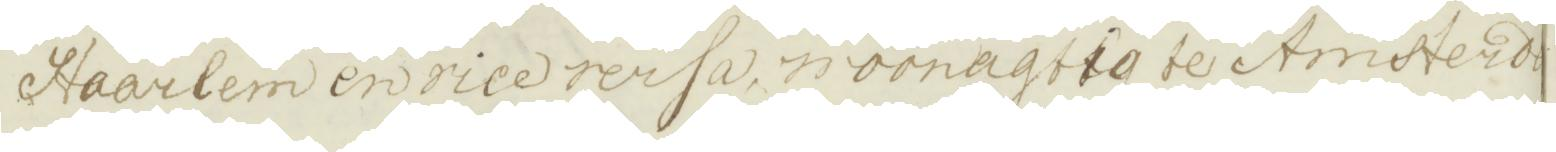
Haarlem en vice versa, woonagtig te Amsterd
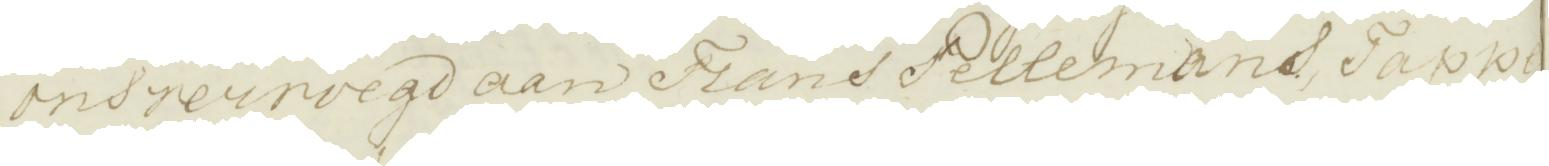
ons vervoegd aan Frans Pellemans, Tappe
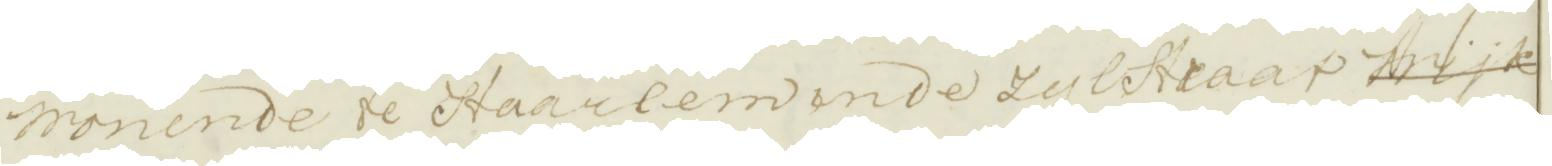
wonende te Haarlem inde zylstraat wijk
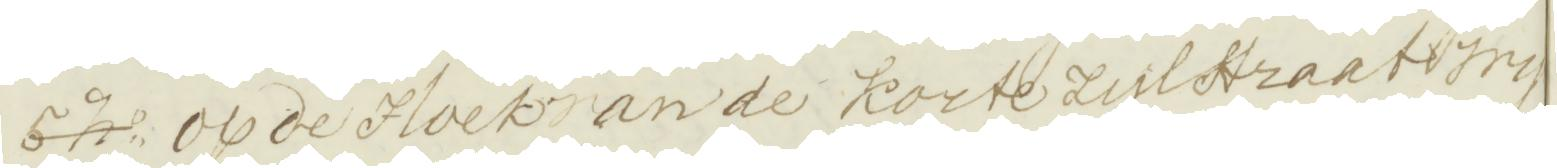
5 n„o op de Hoek van de korte zylstraat wy
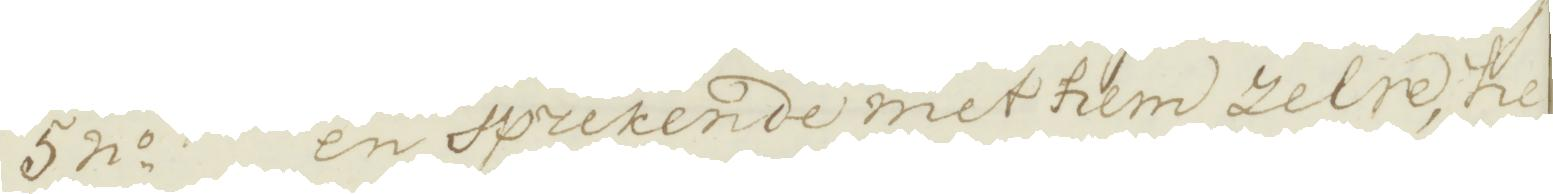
5 n„o en sprekende met hem zelve, he
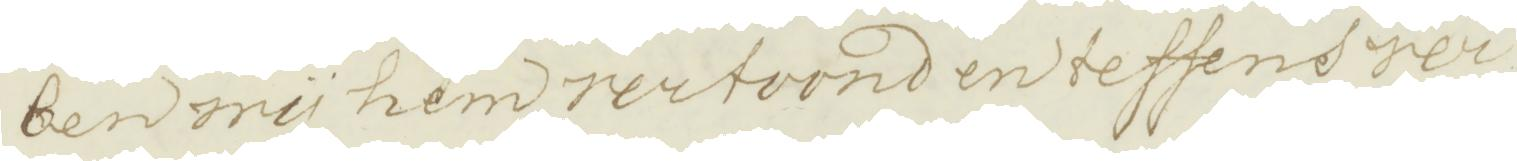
ben wij hem vertoond en teffens ver
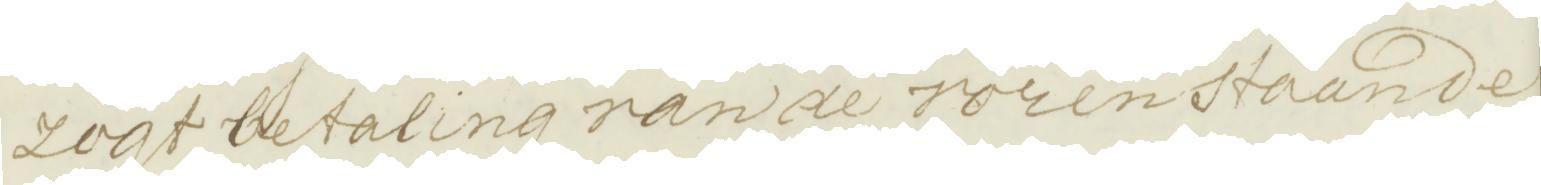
zogt betaling van de vorenstaande
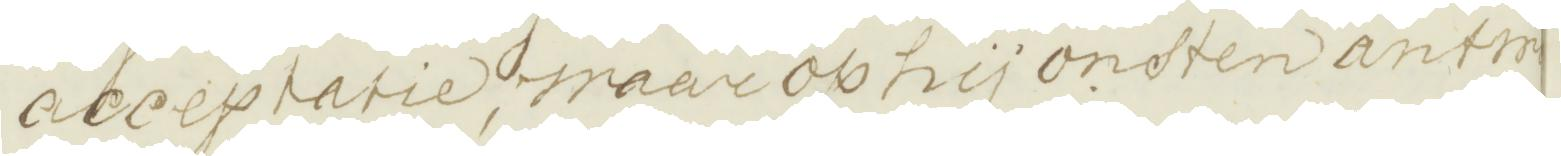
acceptatie, waar op hij onsten antw
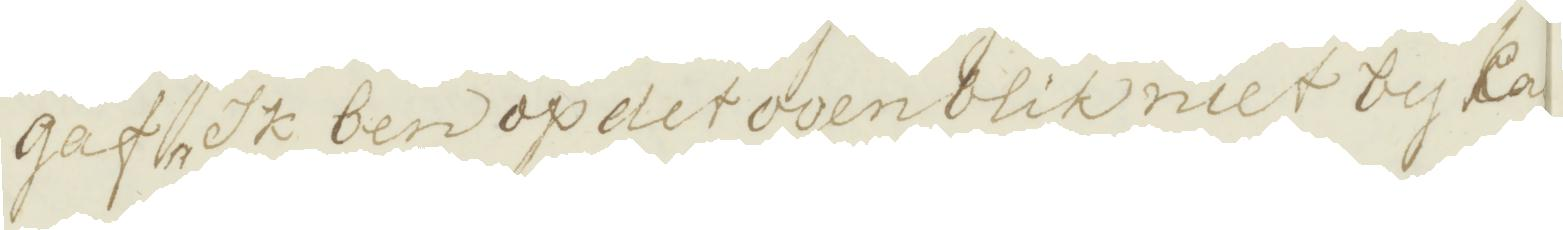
gaf „Ik ben op dit ogenblik niet by ka
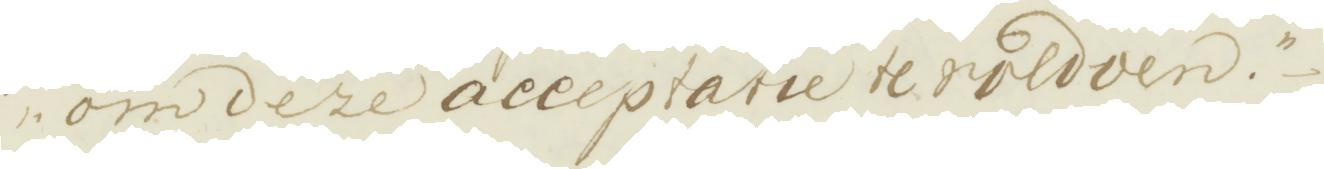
„om deze acceptatie te voldoen."
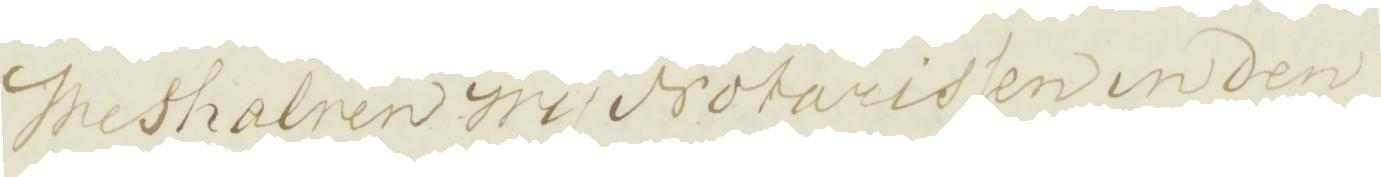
Weshalven wy Notarissen in den
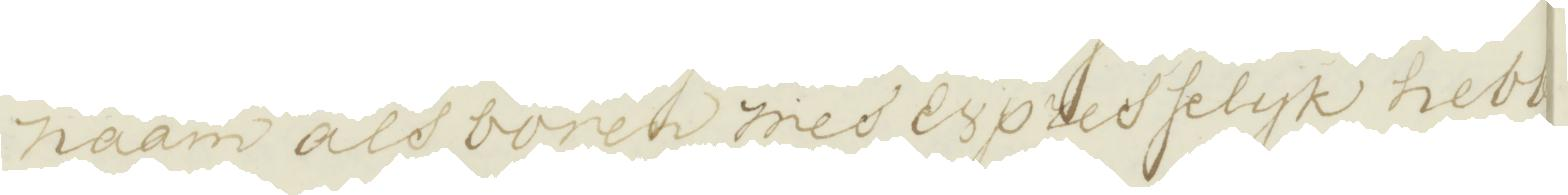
naam als boven wes Expresselyk hebb
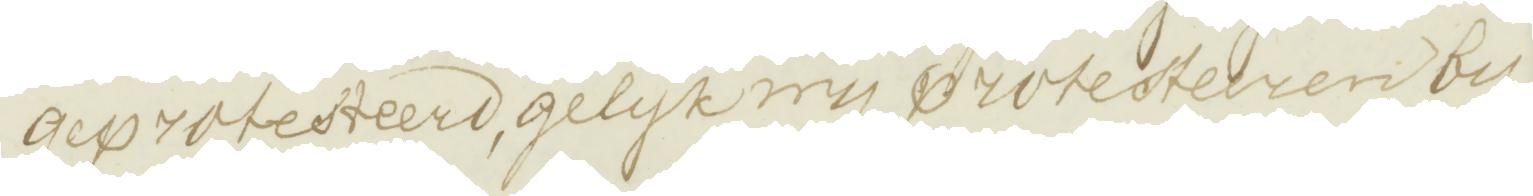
geprotesteerd, gelyk wy protesteeren by
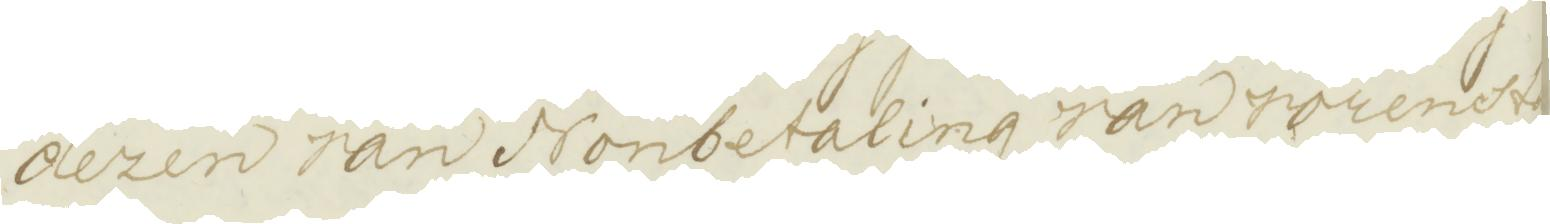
dezen van Nonbetaling van vorenst
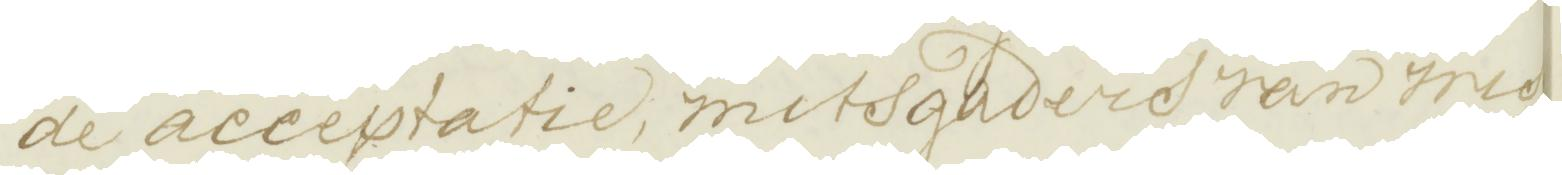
de acceptatie, mitsgaders van wis
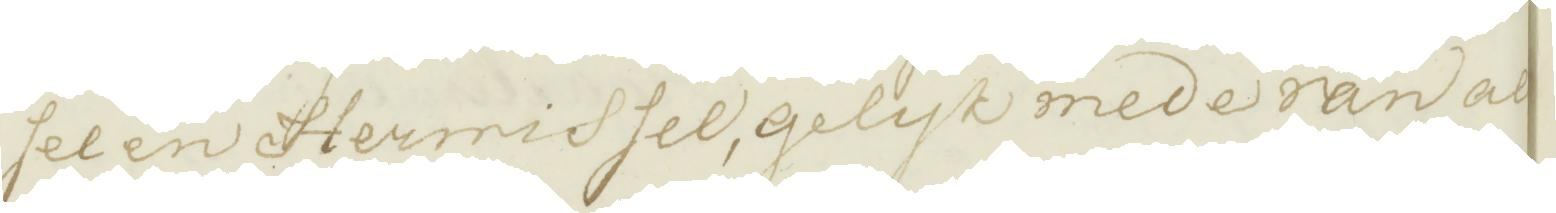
sel en Herwissel, gelyk mede van al
